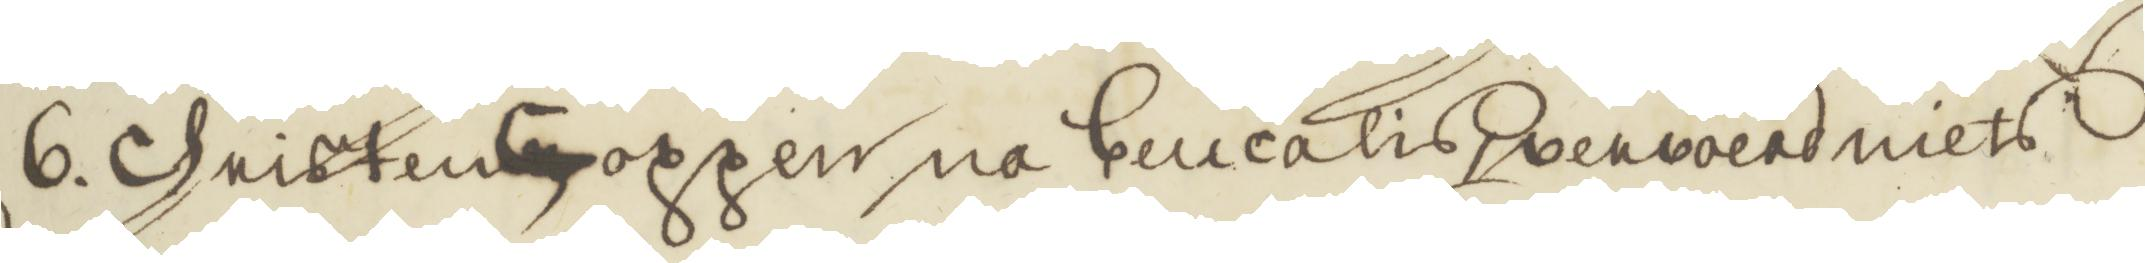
6. Christen Coppen na bencalis, vervoerd niets
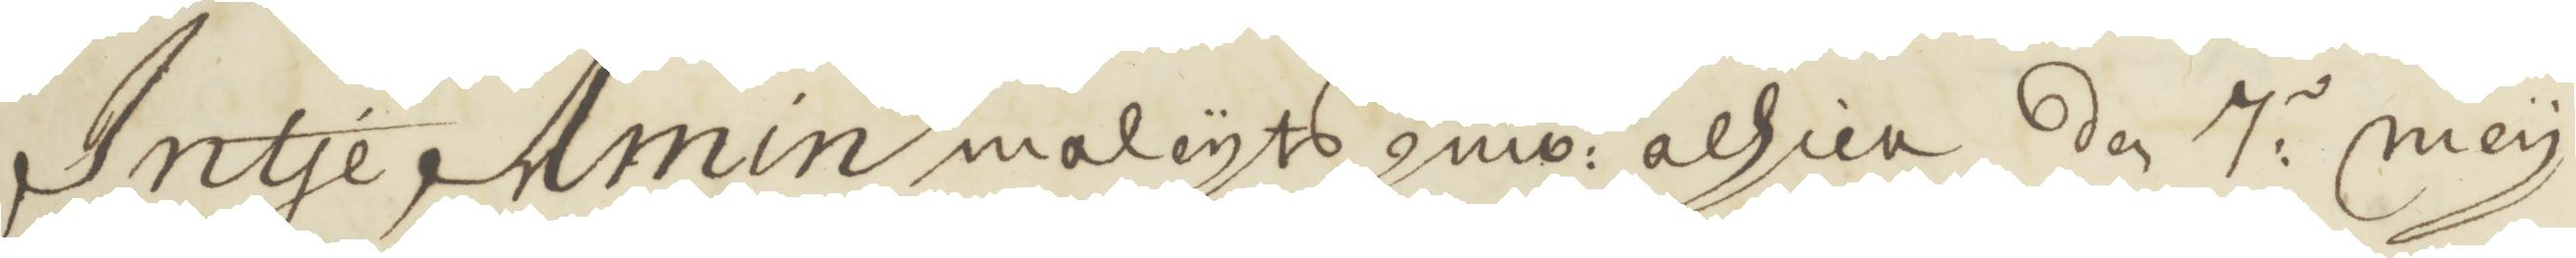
Jntje Amin maleijts jnw:r alhier den 7:' meij
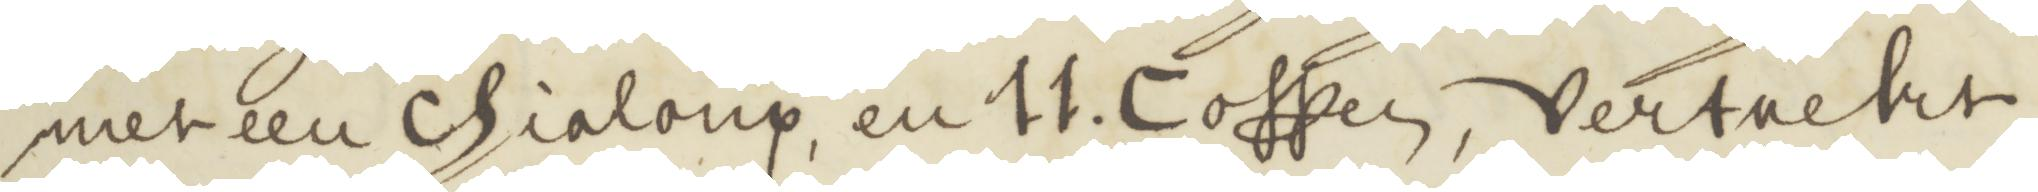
met een chialoup, en 11. Coppen, vertrekt
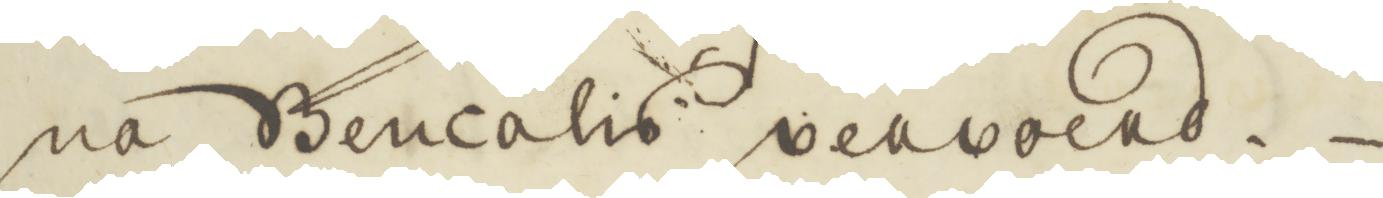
na Bencalis vervoerd.
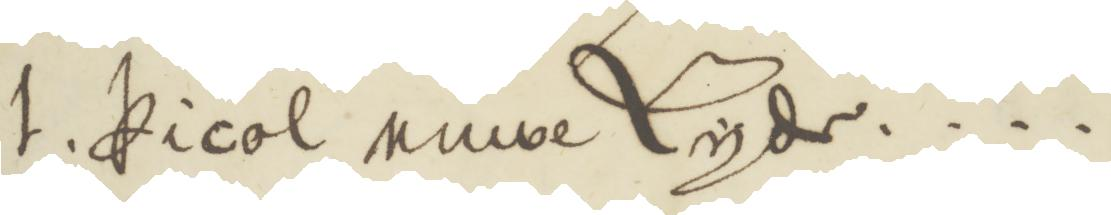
1. Picol ruwe zijde . . . . . . .
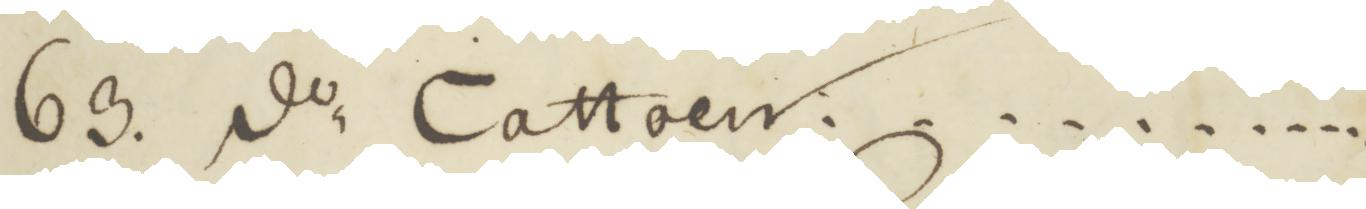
63. d„o Cattoen . . . . . . . . . .
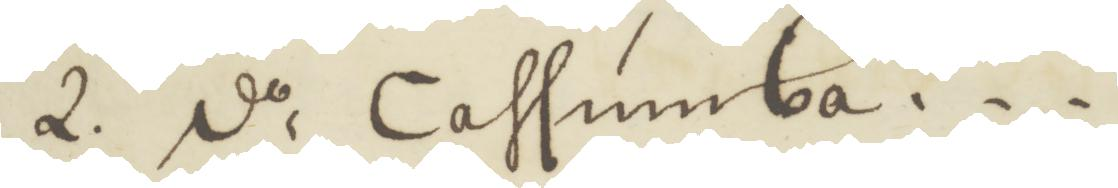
2. d„o Cassumba . . . . . .
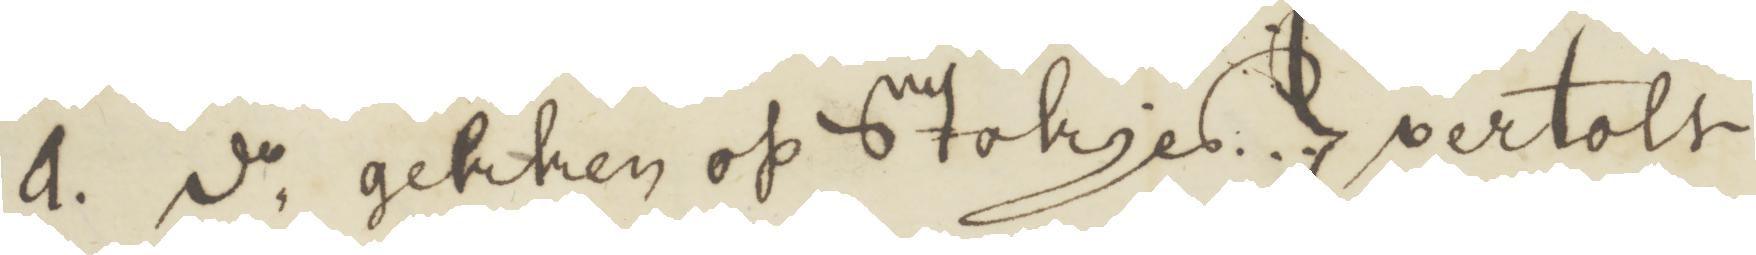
4. d„o gekken op stokjes . . . vertolt
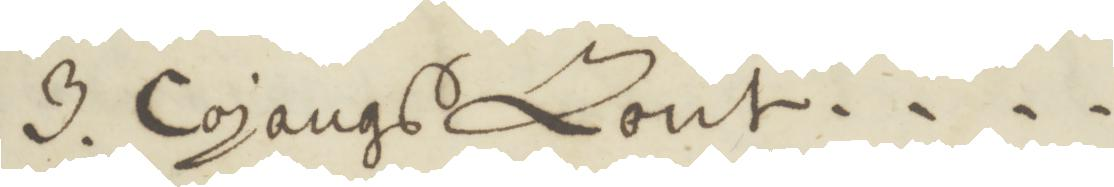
3. Cojangs zout . . . . . . .
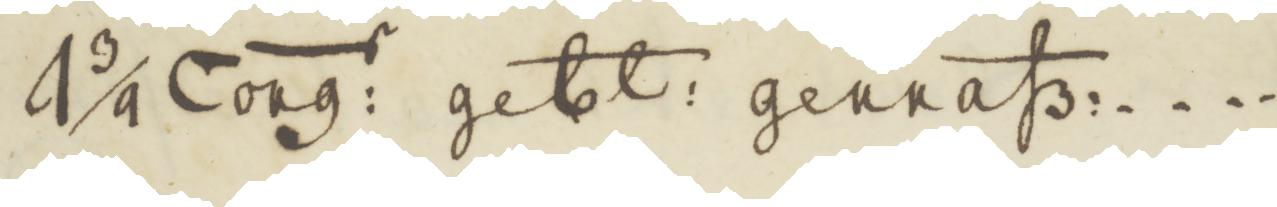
4¾ Corg:s gebl: gerrasz: . . . .
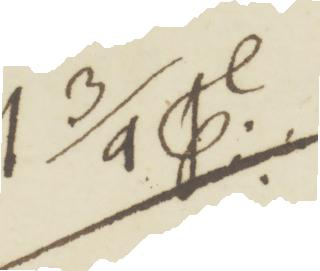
1¾ p:l
